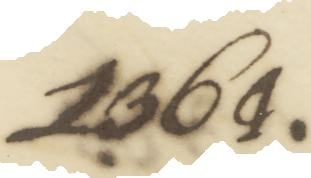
1364.
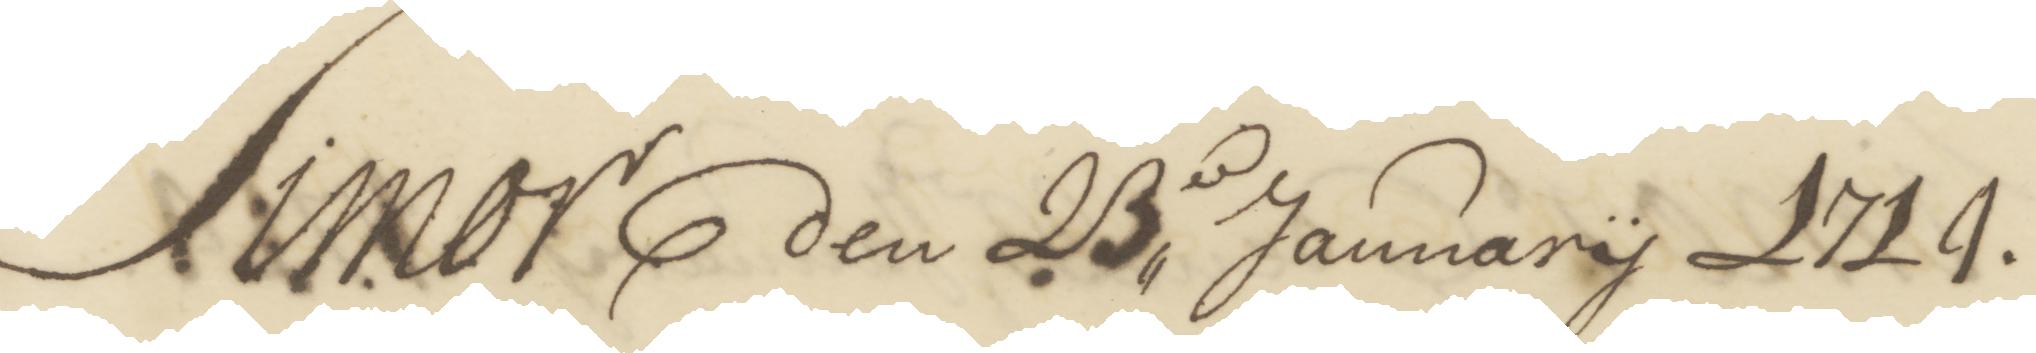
Timor den 23„en Januarij 1714.
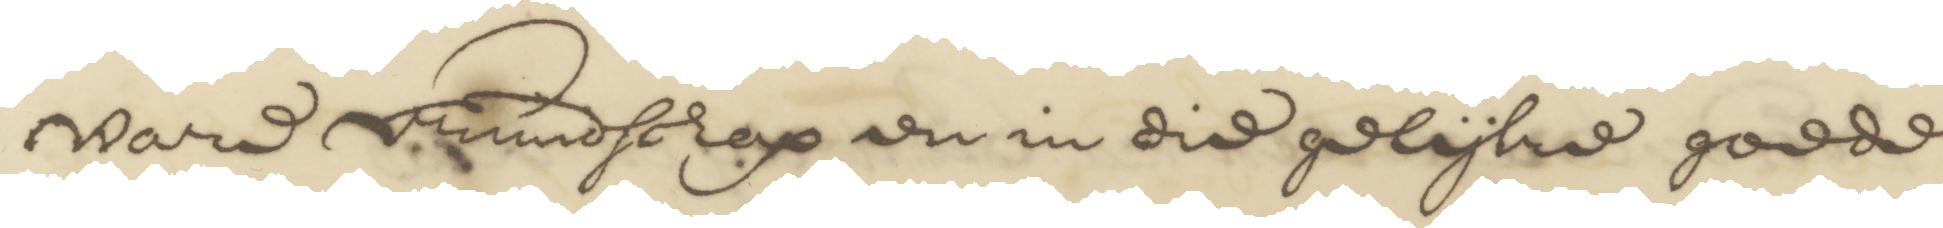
ware vrundschap en in die gelijke goede
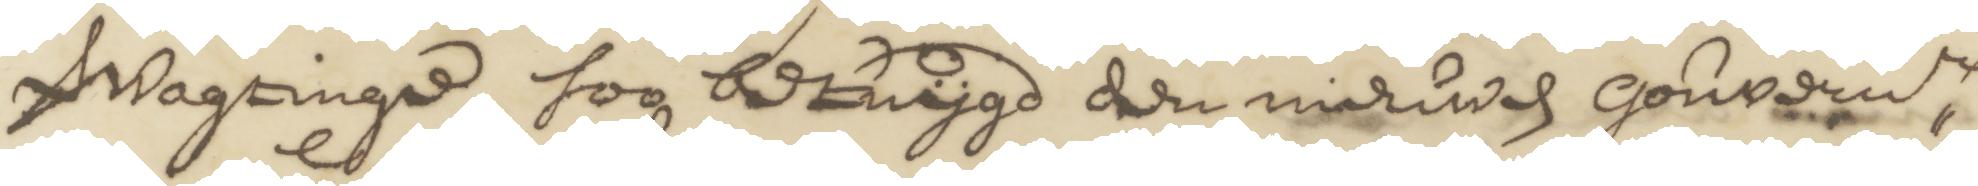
verwagtinge soo betuijgd den nieuwen gouvern„r
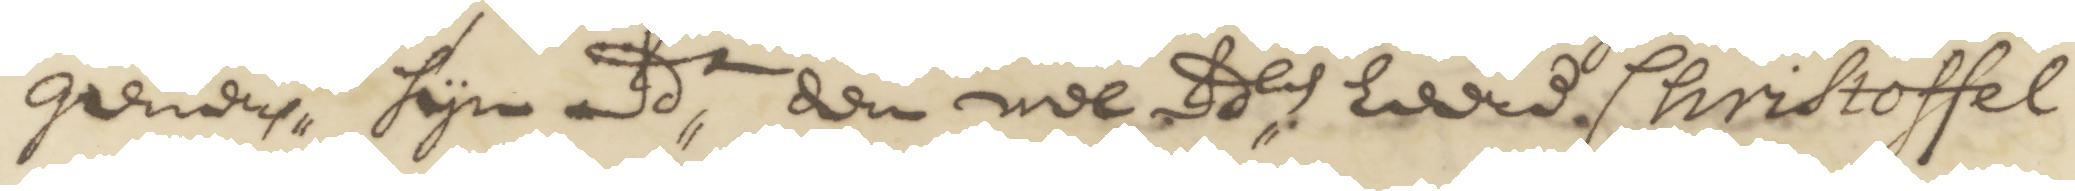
Gener„l sijn Ed„e den wel Ed„len heere Christoffel
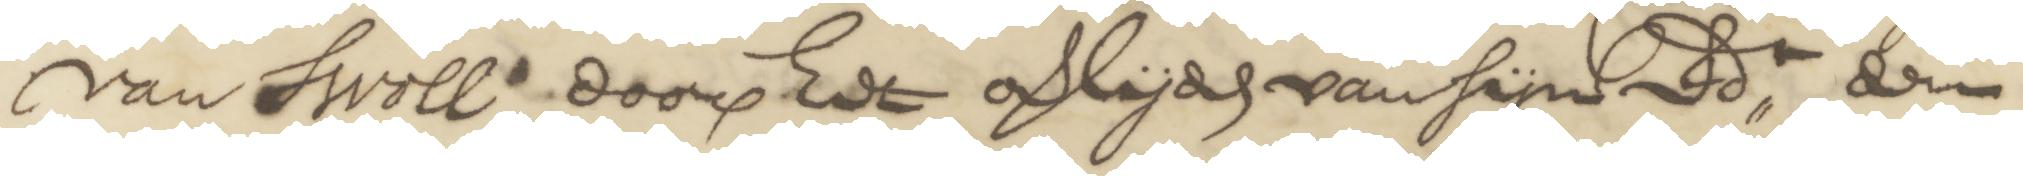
van swoll door het overlijden van sijn Ed„e den
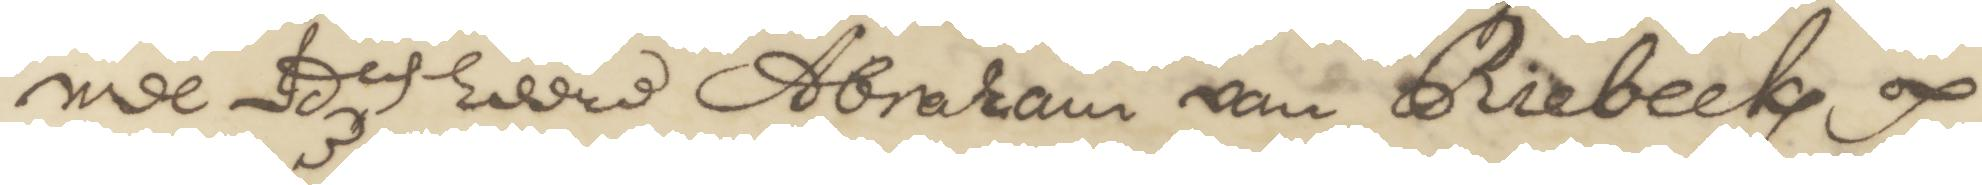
wel Ed:len heere Abraham van Riebeek op
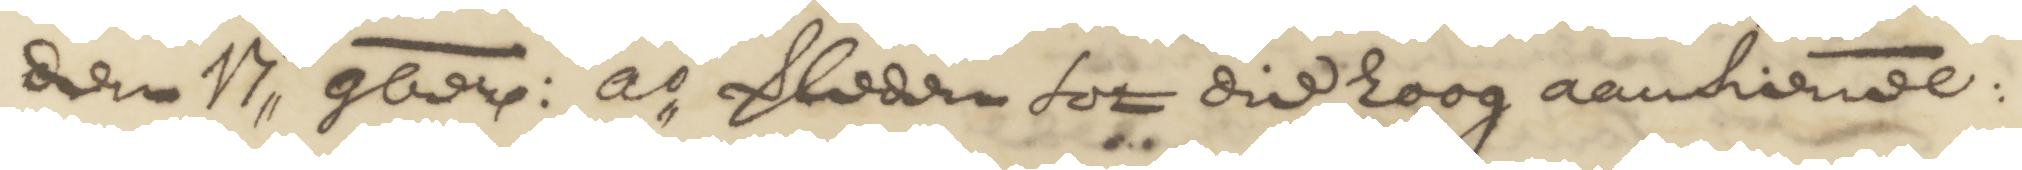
den 17„e 9ber: a„o verleden tot die hoog aansienel:
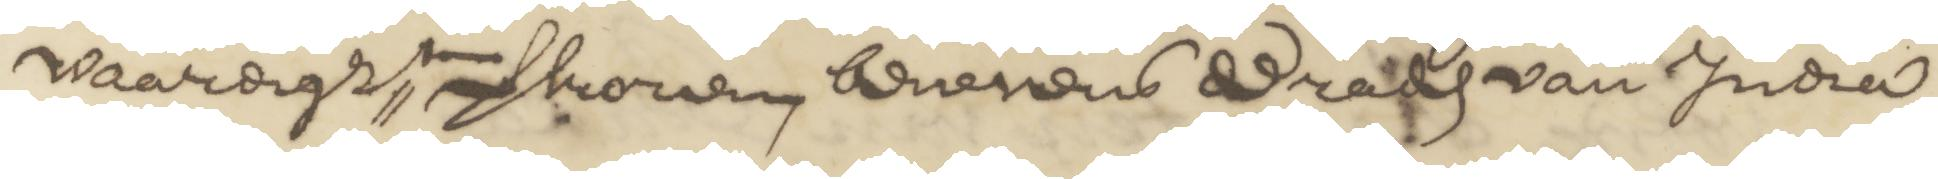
waardigh„t verkoren benevens de raden van India,
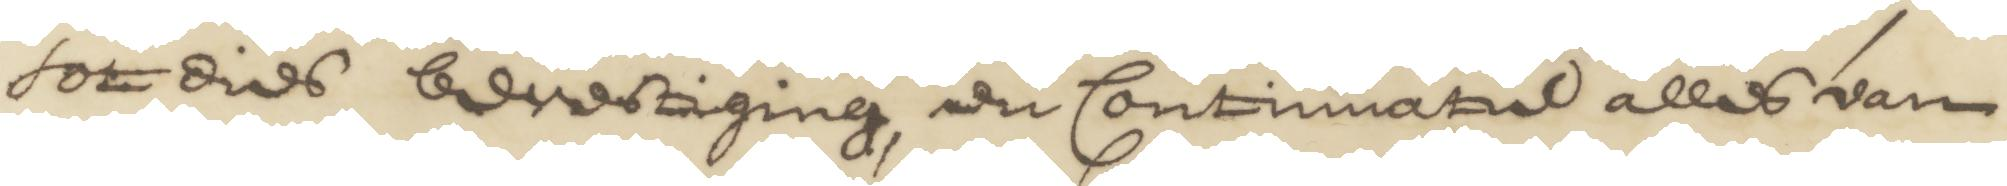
tot dies bevestiging, en Continuatie alles van
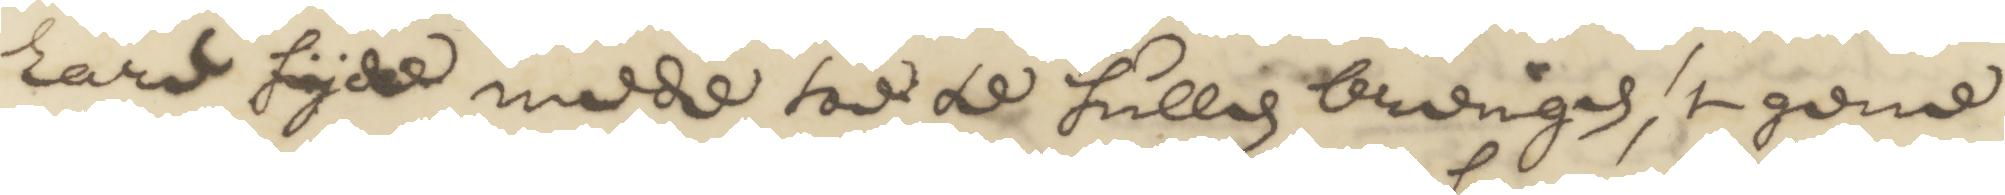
hare sijde mede toe te sullen brengen, ’t gene
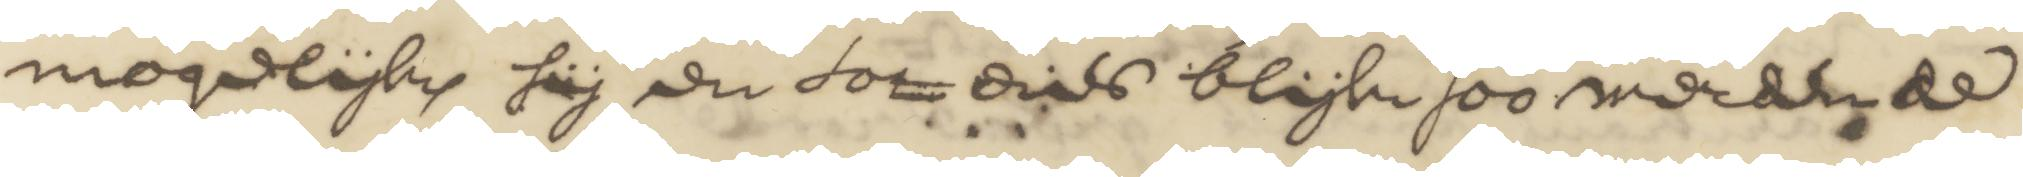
mogelijk sij, en tot dies blijk soo werden de
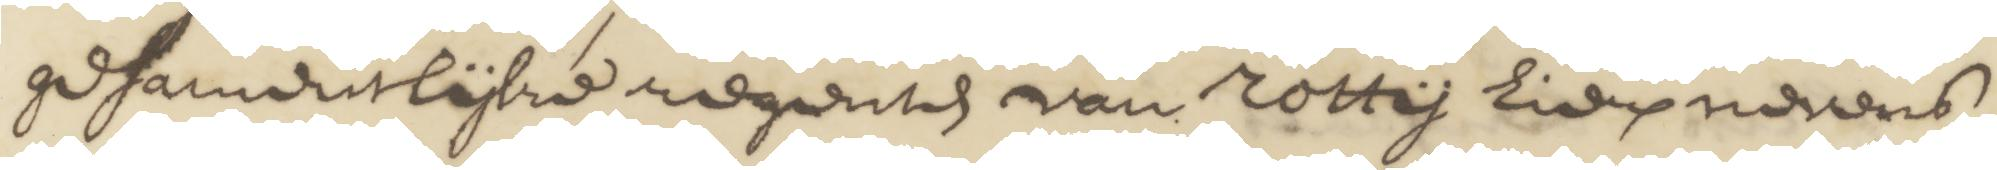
gesamentlijke regenten van rottij hier nevens
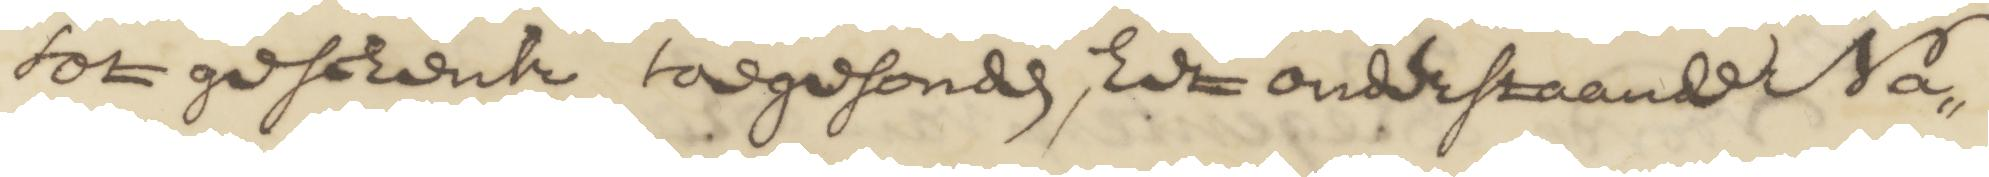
tot geschenk toegesonden, het onderstaande Na„
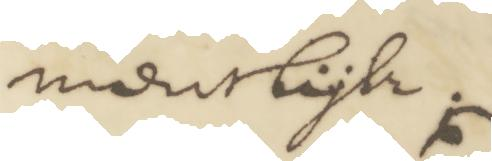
mentlijk:
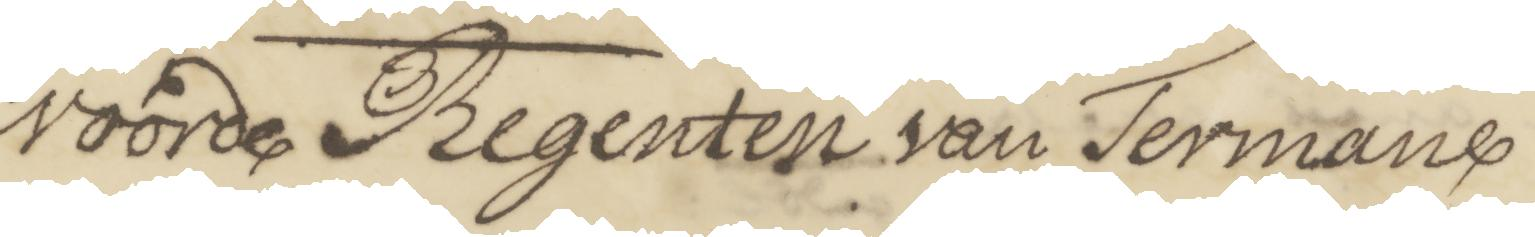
voorde Regenten van Termane
